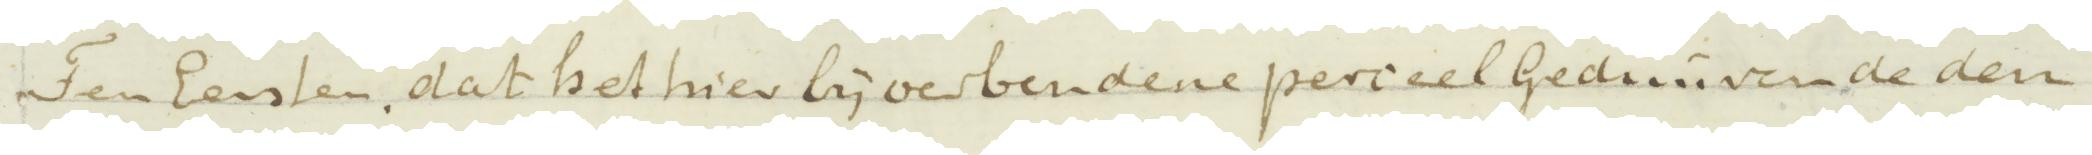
Ten Eersten, dat het hier bij verbondene perceel Geduurende den
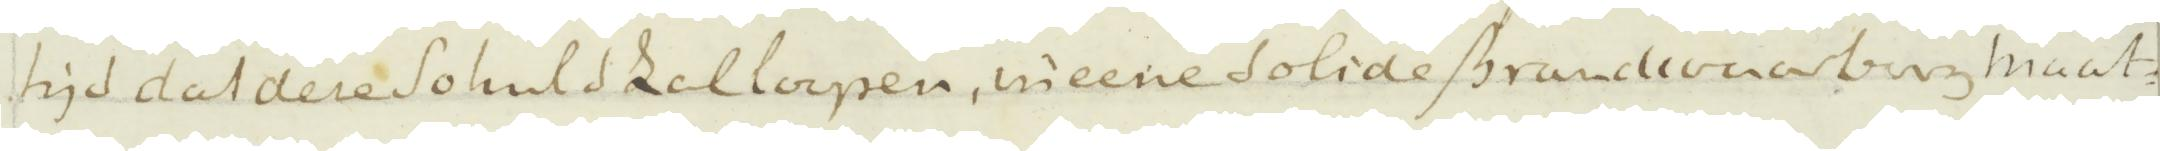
tijd dat deze Schuld zal loopen, in eene solide Brandwaarborg Maat
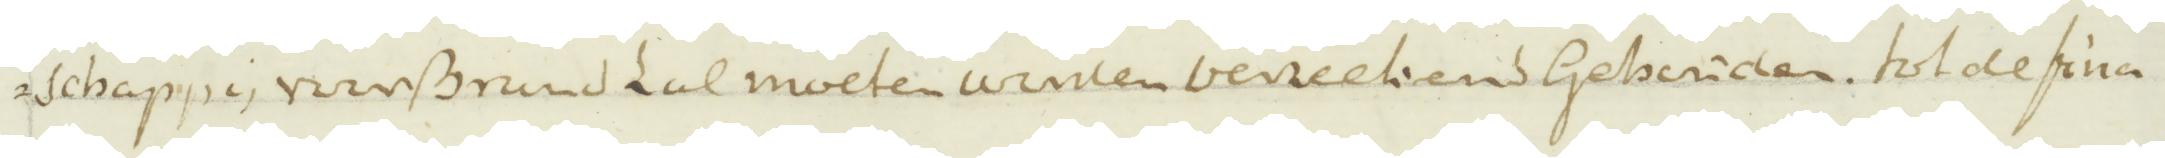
„schappij voor Brand zal moeten worden verzeekerd Gehouden, tot de fina
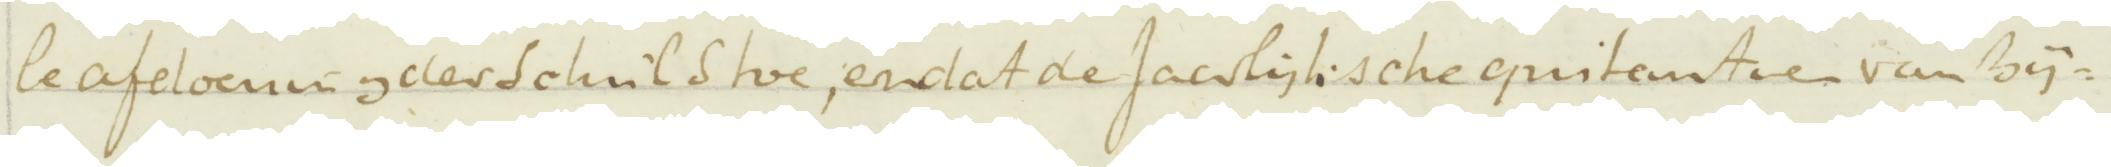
le afdoening der schuld toe, en dat de Jaarlijksche quitantien van Bij„
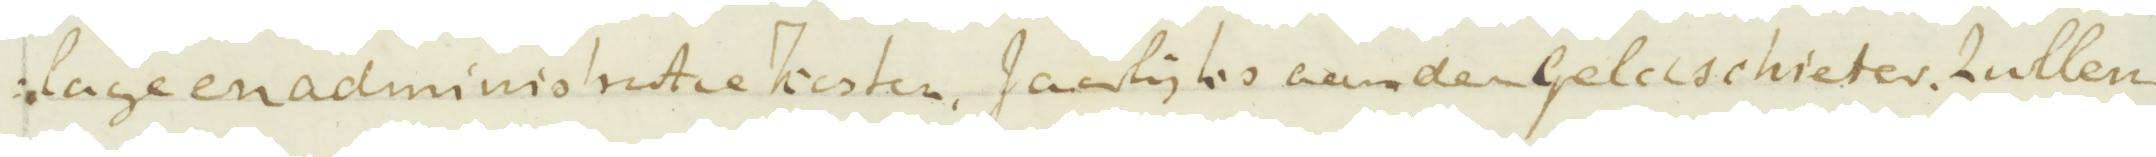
„lage en administratie Kosten, Jaarlijks aan den Geldschieter, zullen
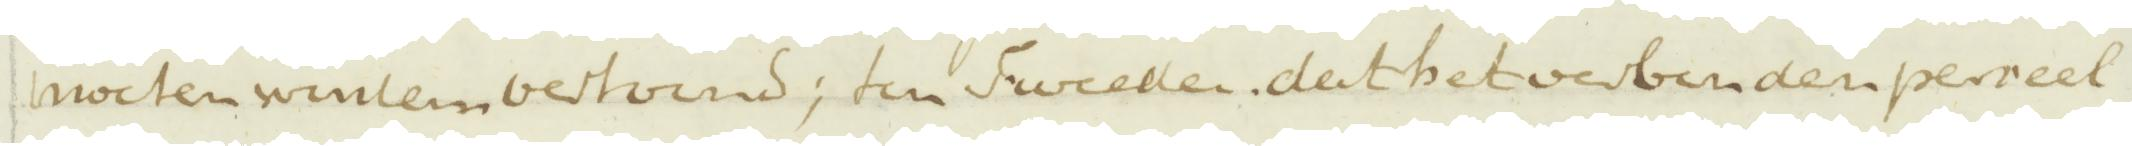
moeten worden vertoond; ten Tweeden, dat het verbonden perceel
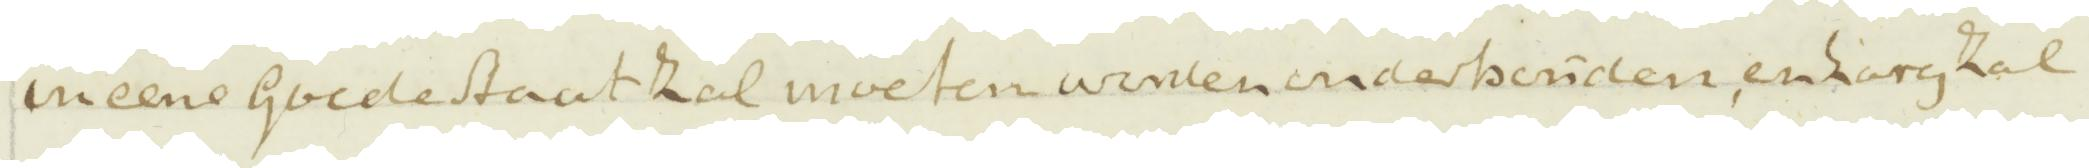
in eene Goede staat zal moeten worden onderhouden, en zorg zal
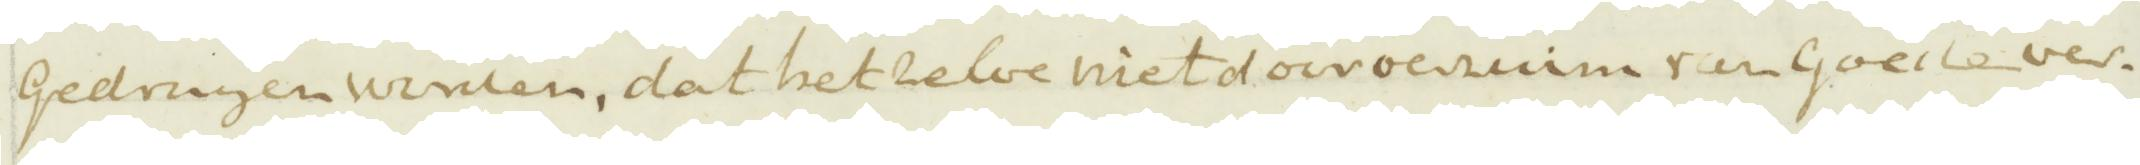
Gedragen worden, dat het selve niet door versuim van Goede ver-
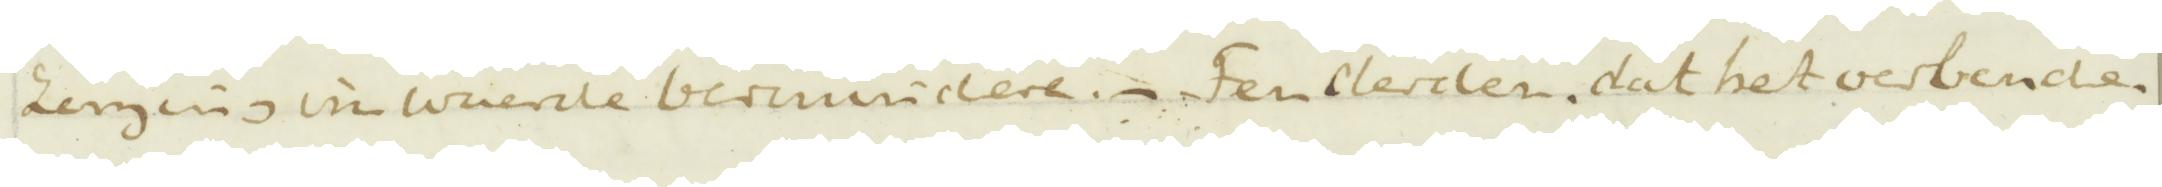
Zorging in waerde verminderen. — Ten derden, dat het verbonde-
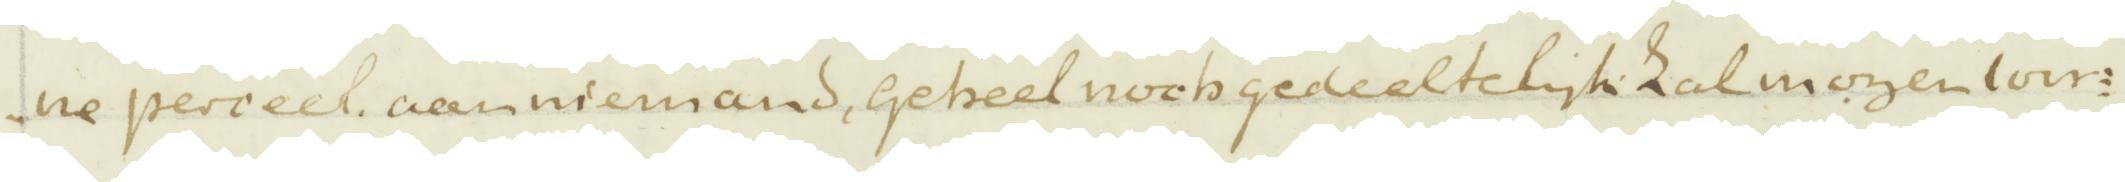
„ne perceel, aan niemand, Geheel noch gedeeltelijk zal mogen wor„
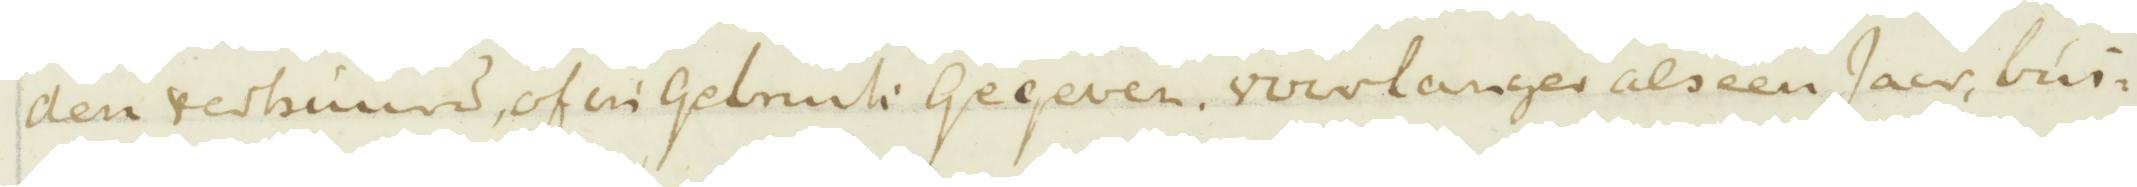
den verhuurd, of in Gebruik Gegeven, voor langer als één Jaar, bui„
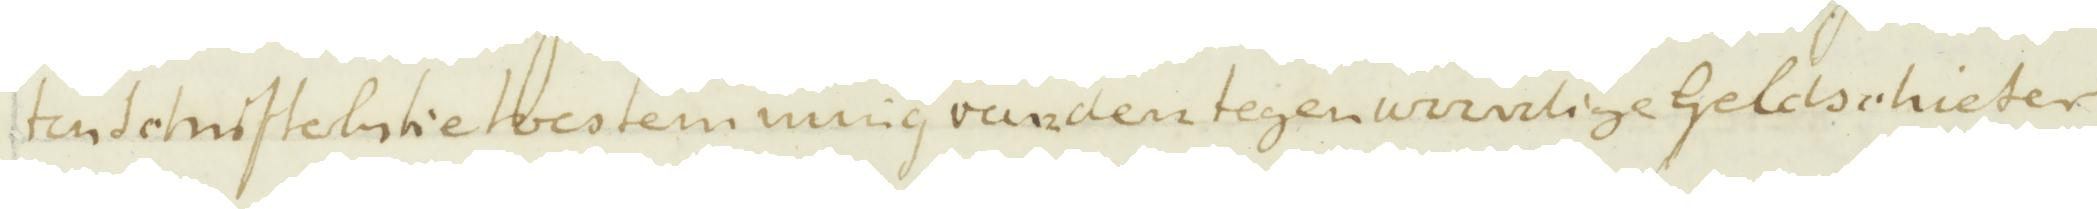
ten schriftelyke toestemming van den tegenwoordige Geldschieter
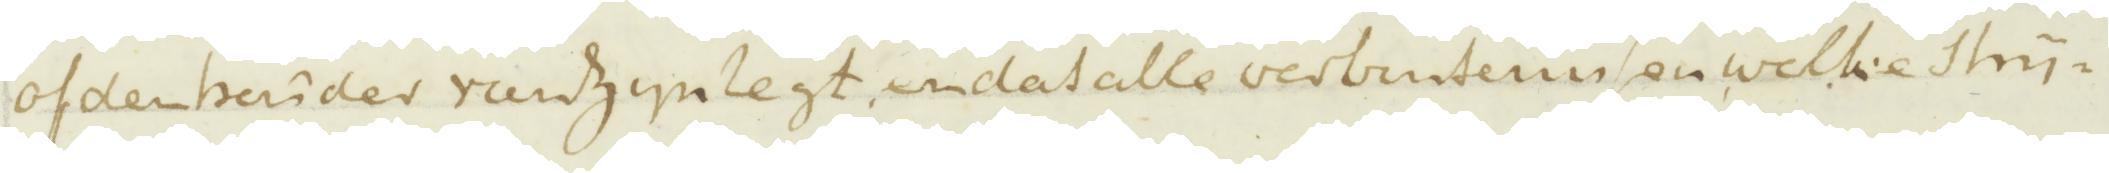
of den houder van Zyn Regt, en dat alle verbintenissen, welke strij„
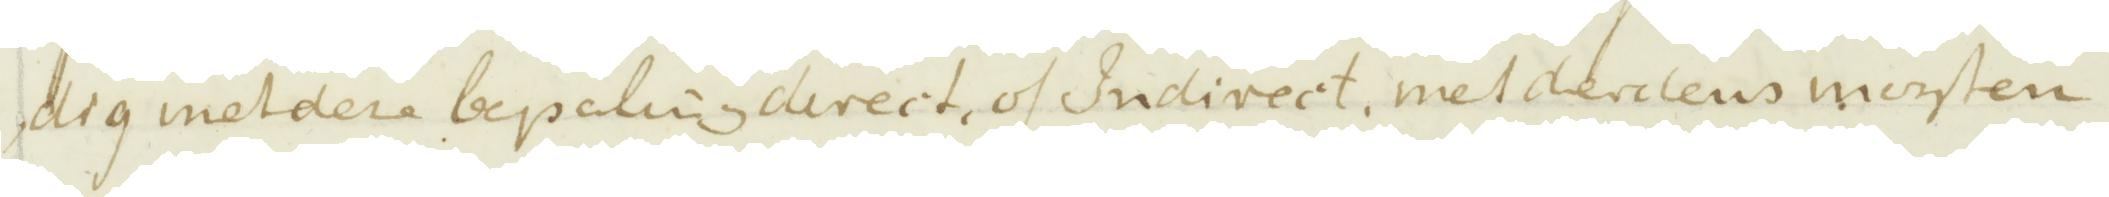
,dig met dese bepaling direct, of Indirect, met derdens mogten
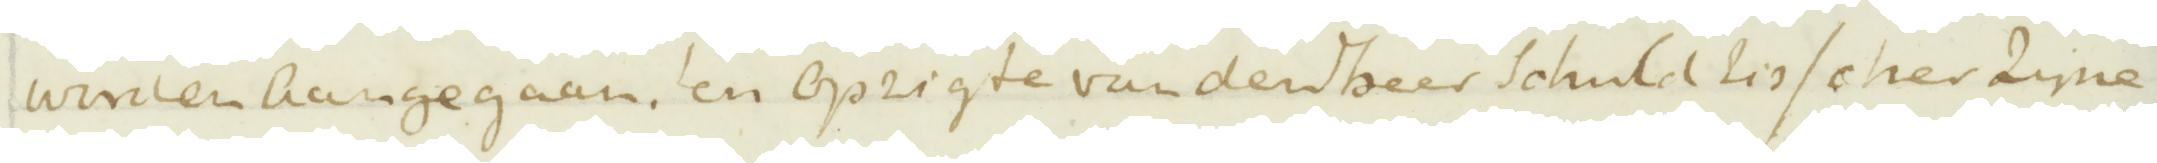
worden Aangegaan, ten Opsigte van den Heer schuld Eisscher Zijne
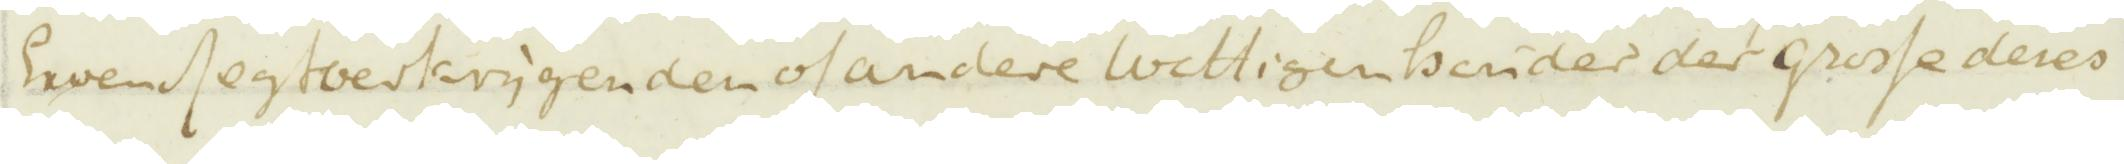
Erven Regt verkrijgenden of andere wettigen houder der grosse dezes
